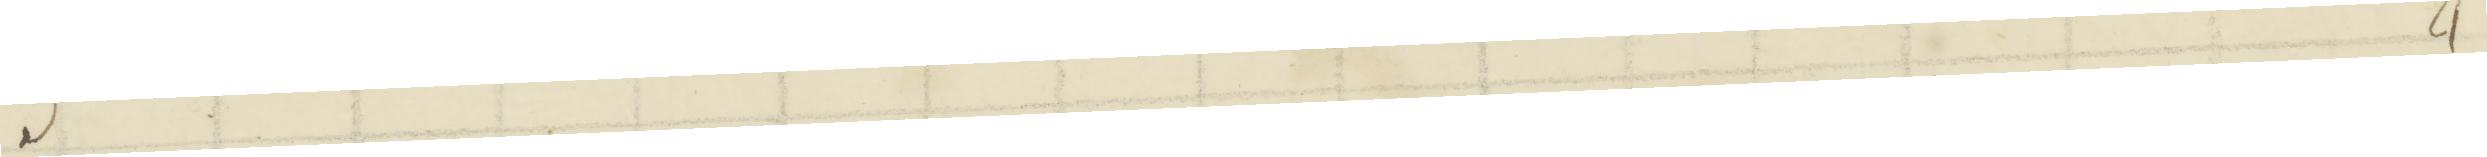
3 4
